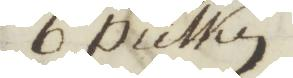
6 piekken
